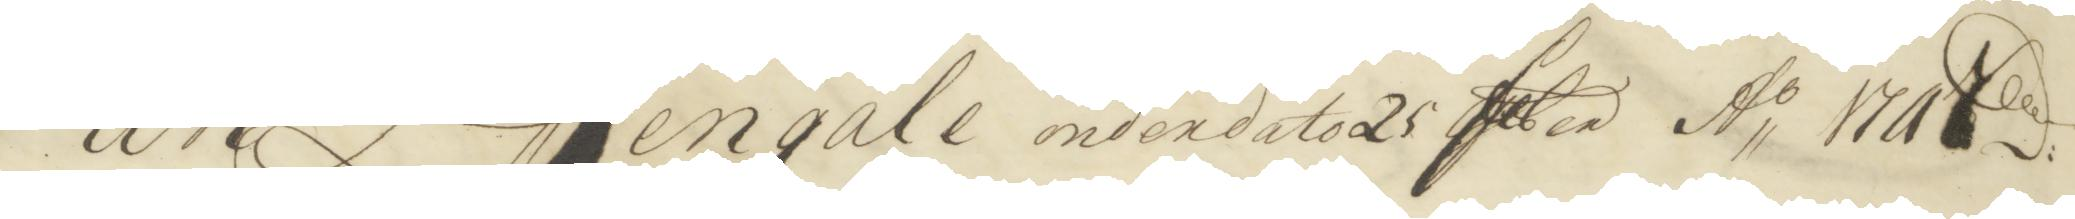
Van Bengale onder dato 25 feber A„o 1747.
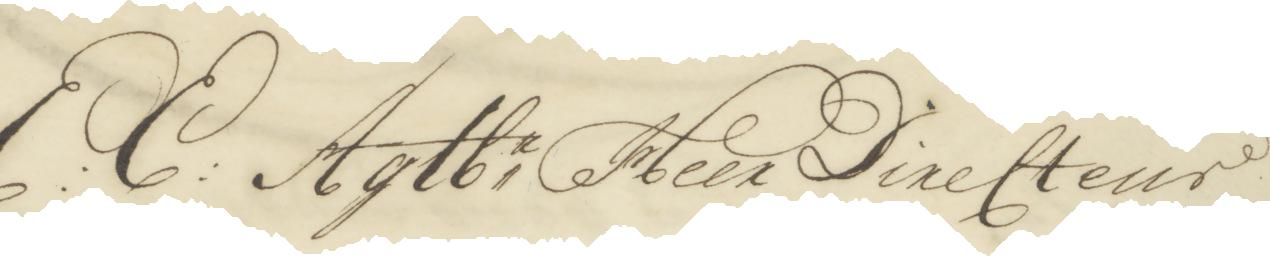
E: E: Agtb„r Heer Directeur
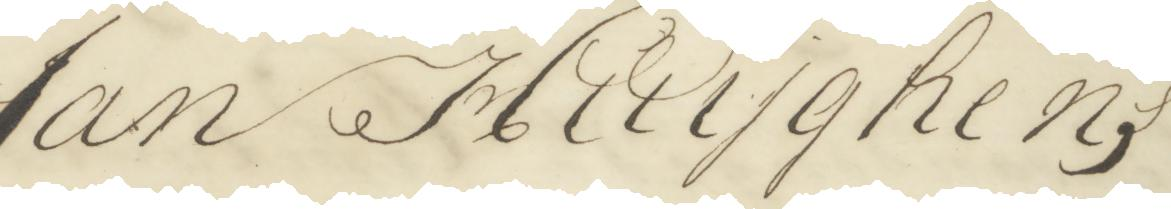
Jan Huijghens
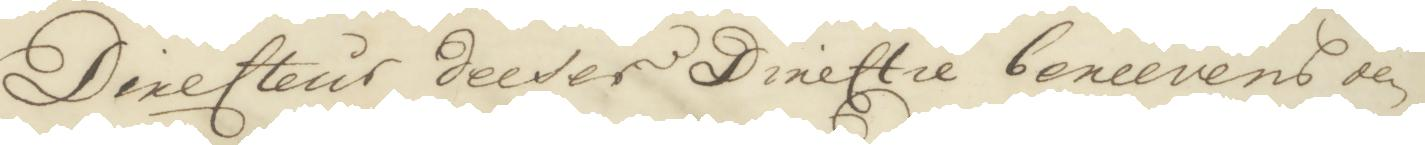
Directeur deeser Directie bereevens den
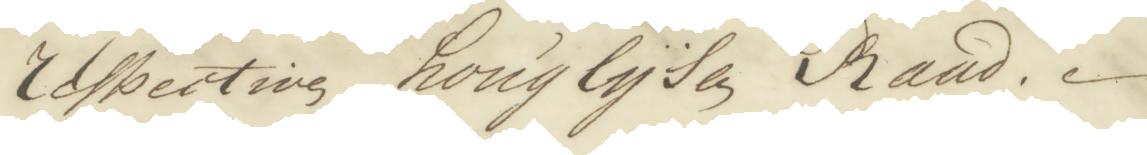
Respectiven houglijsen Raad. _
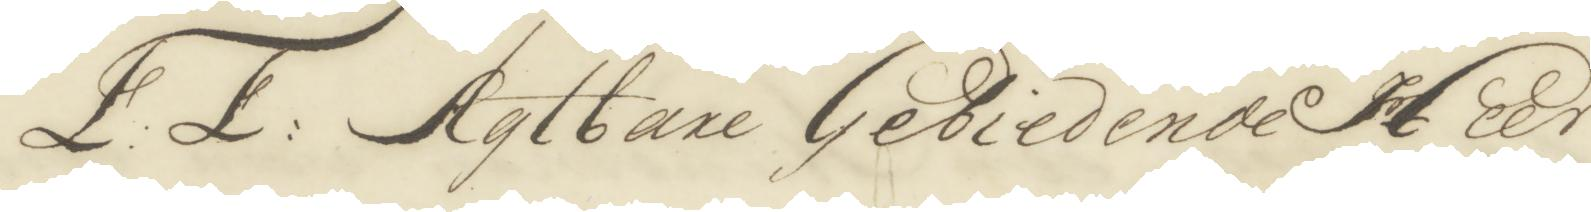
E: E: Agtbare Gebiedende Heer
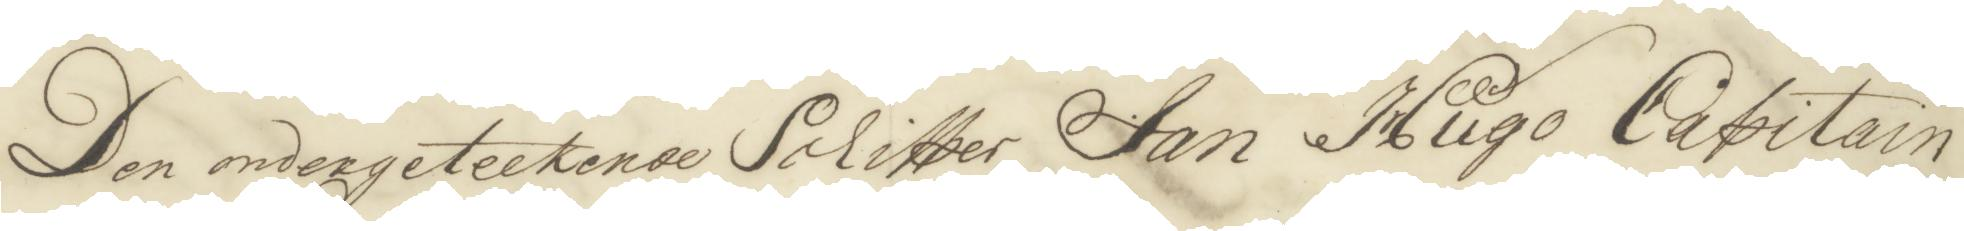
Den ondergeteekende Schipper Ian Hugo Capitain
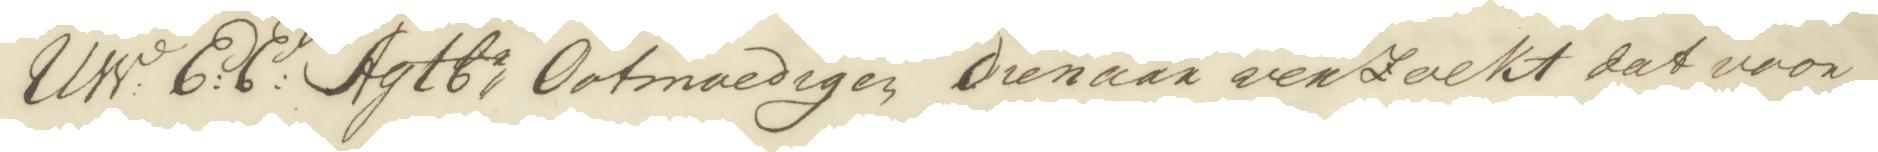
UW: E: E: Agtb„r Ootmoedigen dienaar verzoekt dat voor
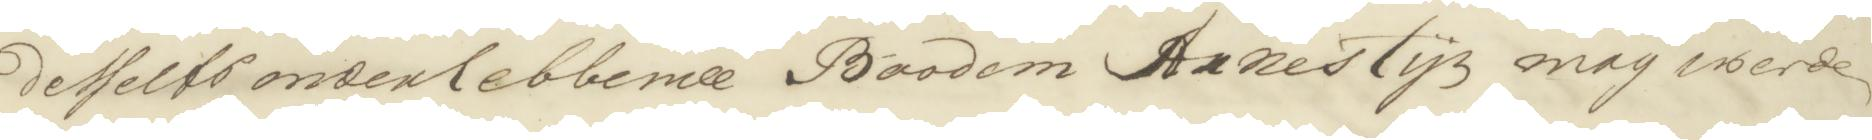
desselfs onderhebbende Boodem Arnestijn mag werden
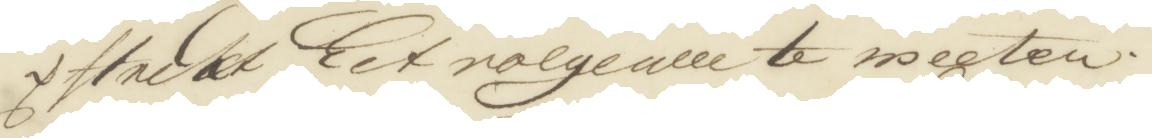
verstrekt het volgende te weeten.
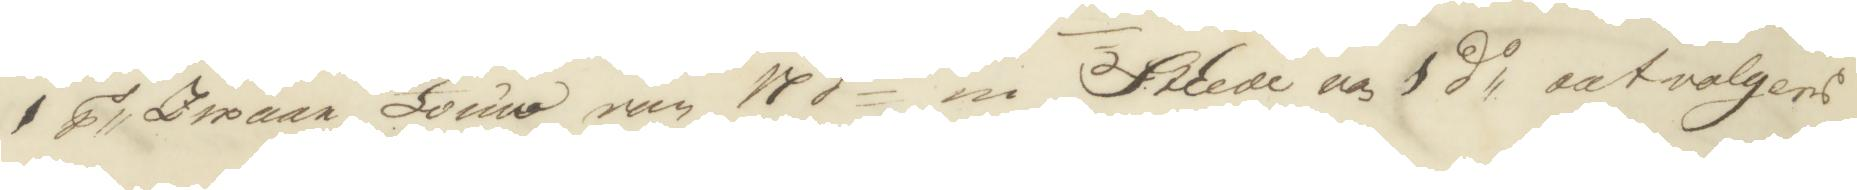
1 p„s Zwaar Touw van 17 d=m in Steede van 1 d„o dat volgens
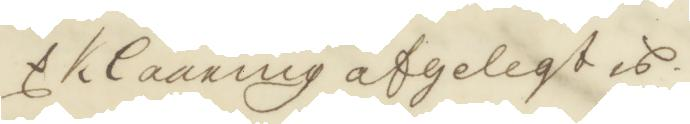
verklaaring afgelegt is.
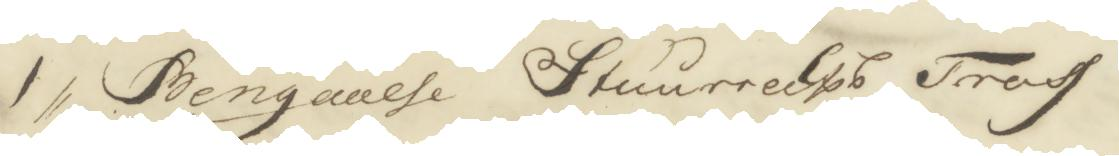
1 „ Bengaalse Stuurreeps Tross
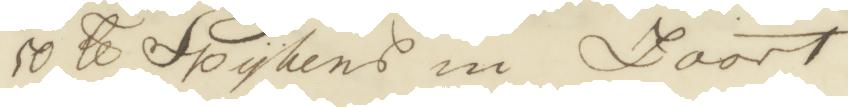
50 lb spijkers in zoort
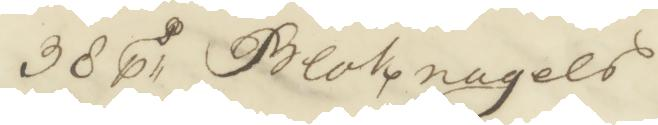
38 p„s Blok nagels
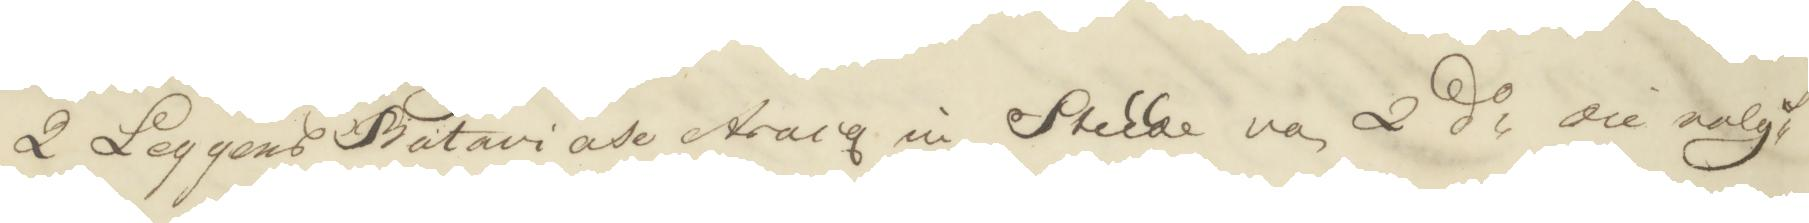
2 Leggers Bataviase Aracq in Steede van 2 d„o die volg„s
